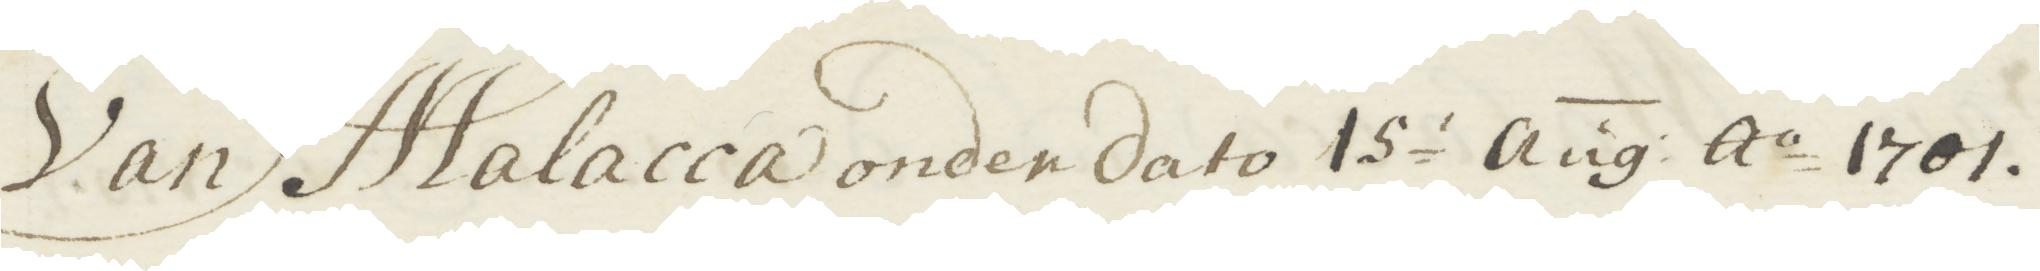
Van Malacca onder dato 15=' Aug: A=o 1701.
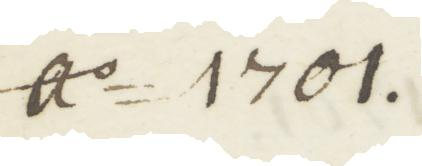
A=o 1701.
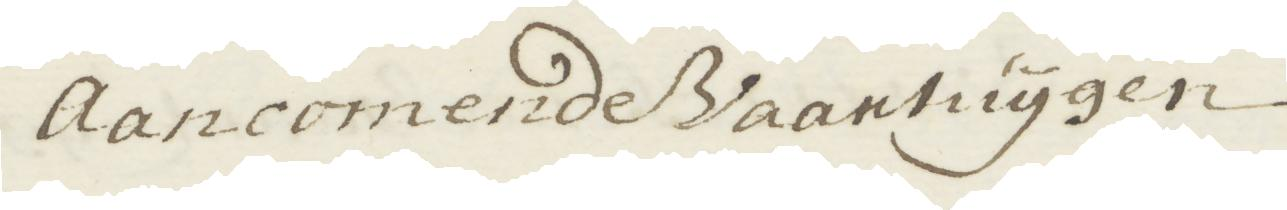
Aancomende Vaartuijgen
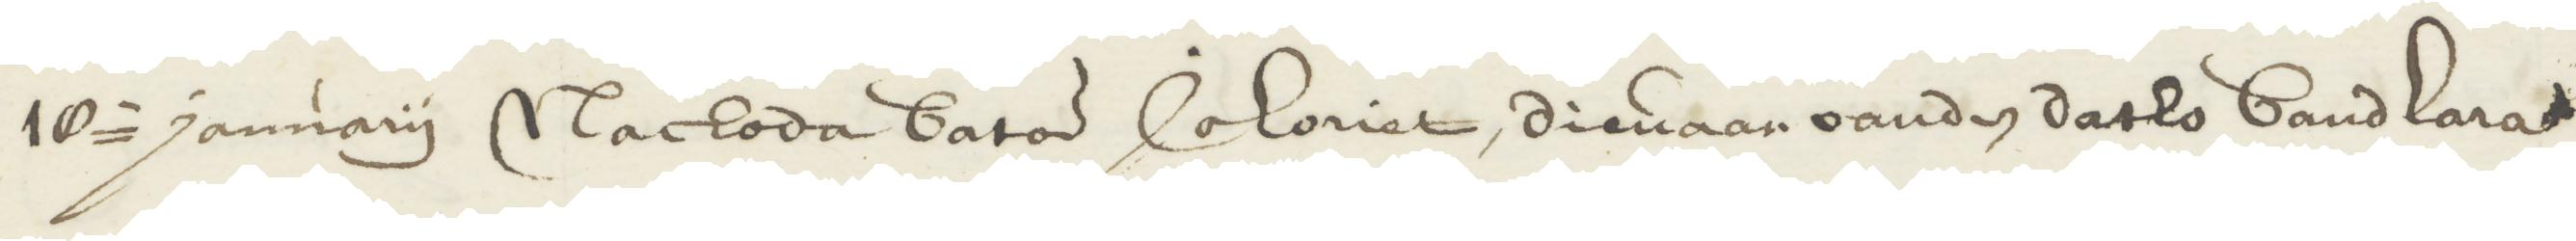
18=' januarij Nachoda batoe Johoriet, dienaar van den datho bandhara
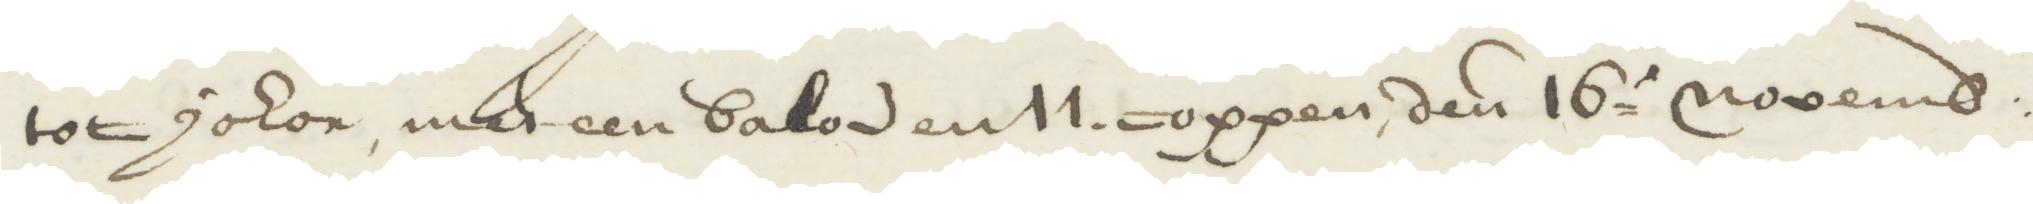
tot johor, met een baloe en 11. coppen, den 16=' novemb:
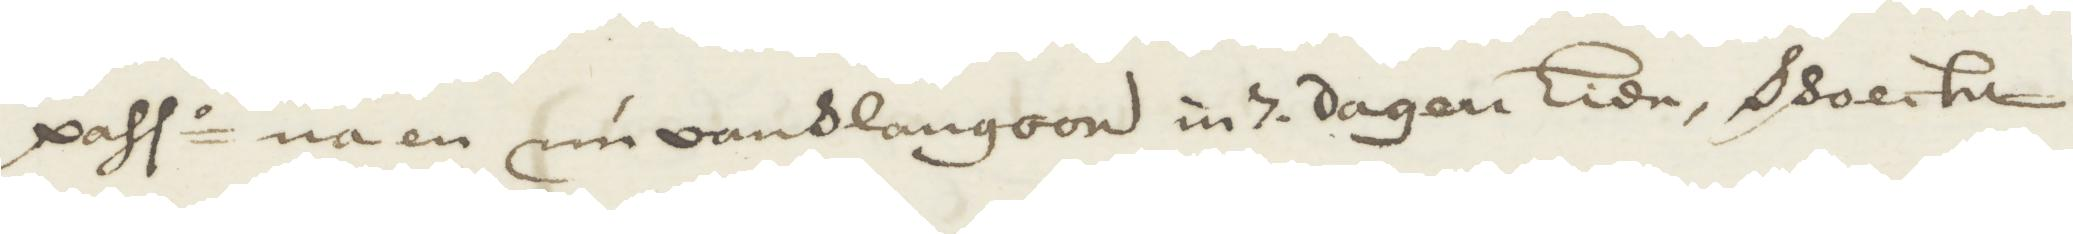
pass=o na en nu van Slangoor in 7. dagen hier, versoeckt
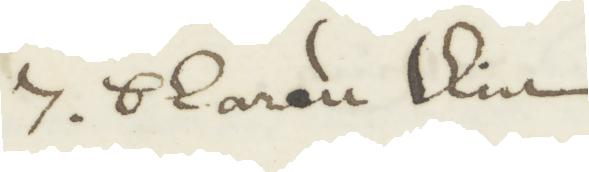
7. bharen thin
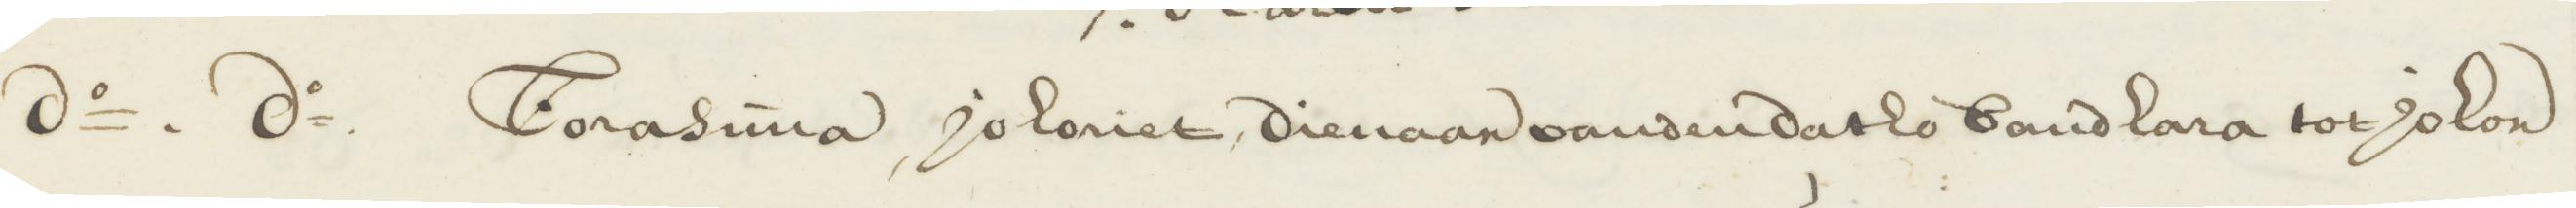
d=o. d=o Torasuna, johoriet, dienaar van den datho bandhara tot johor
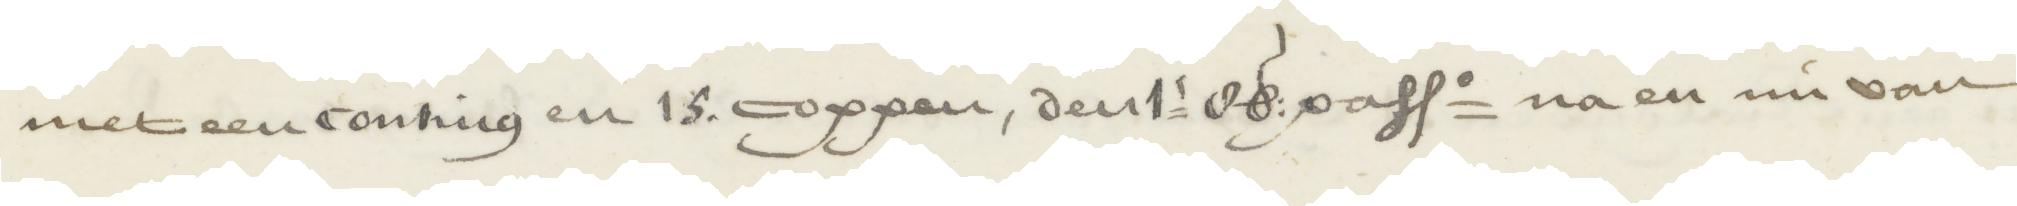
met een conting en 15. coppen, den 1=' 8:br pass=o na en nu van
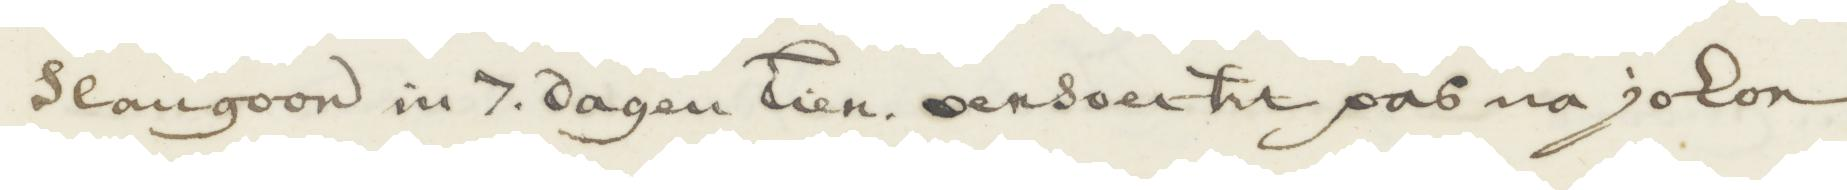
Slangoor in 7. dagen hier. versoeckt pas na johor
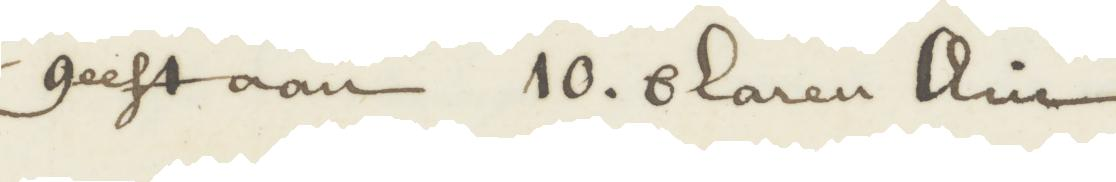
geeft aan 10. bharen thin.
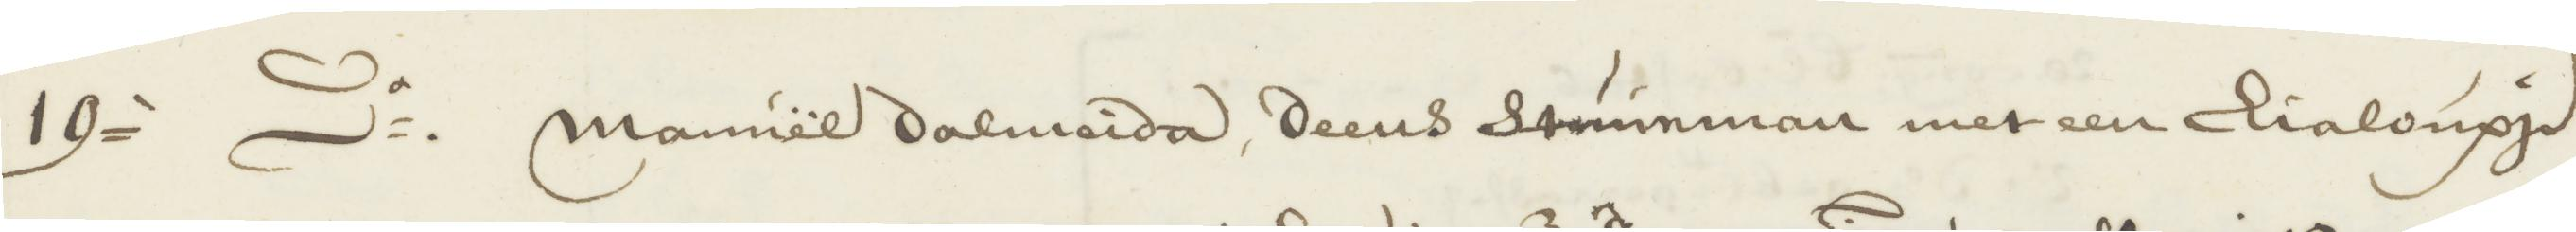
19=' d=o. Manuël dalmeida, deens Stuurman met een chialoupje
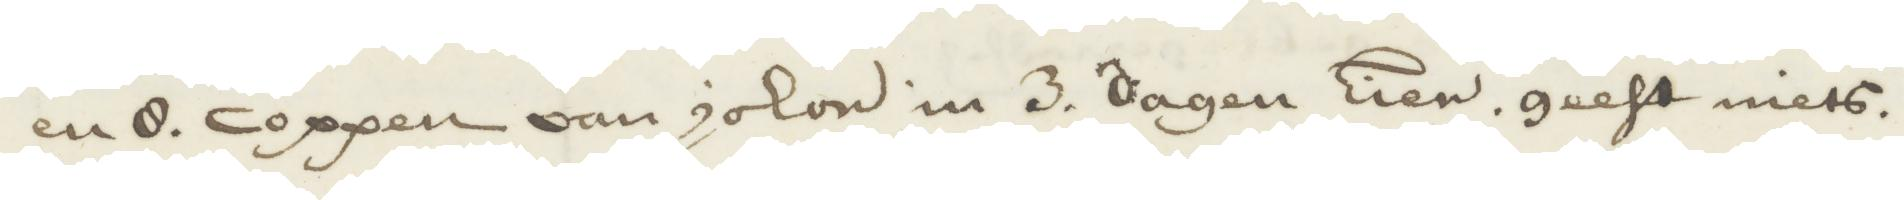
en 8. coppen van johor in 3. dagen hier. geeft niets.
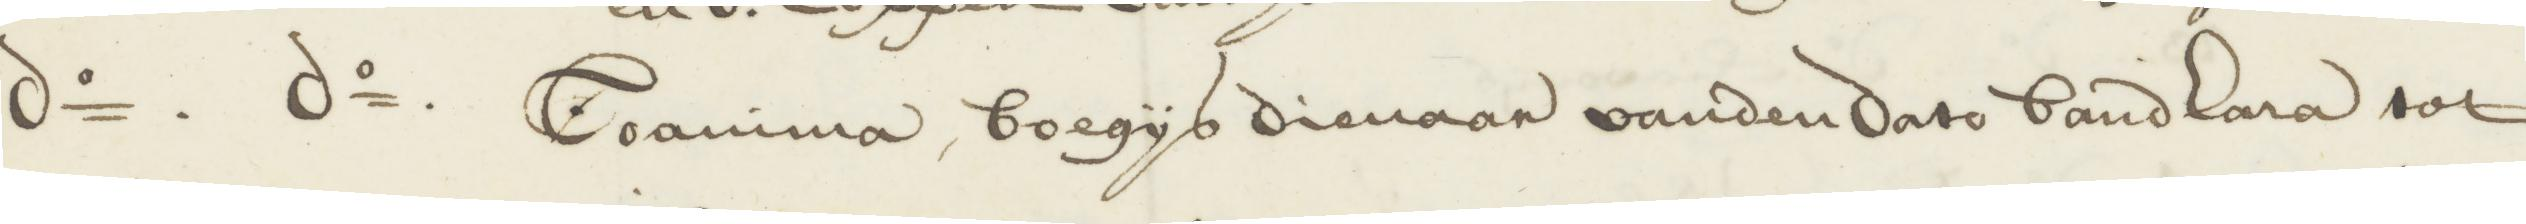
d=o. d=o. Toanima, boegijs dienaar van den dato bandhara tot
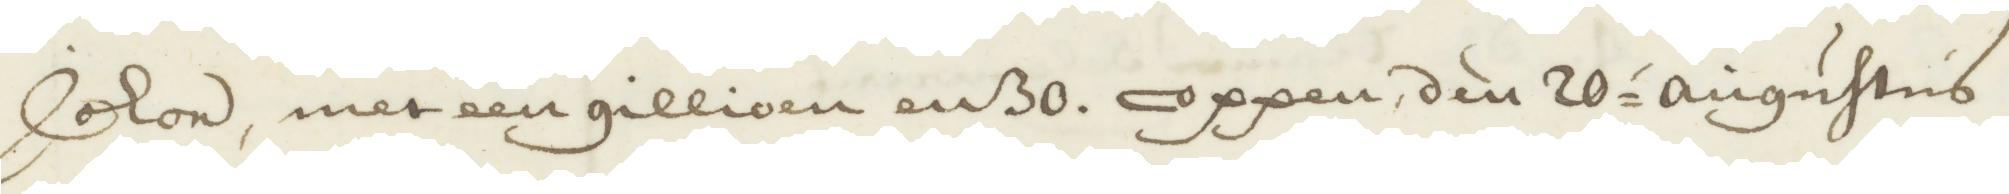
johor, met een gillioen en 30. coppen, den 20=' augustus
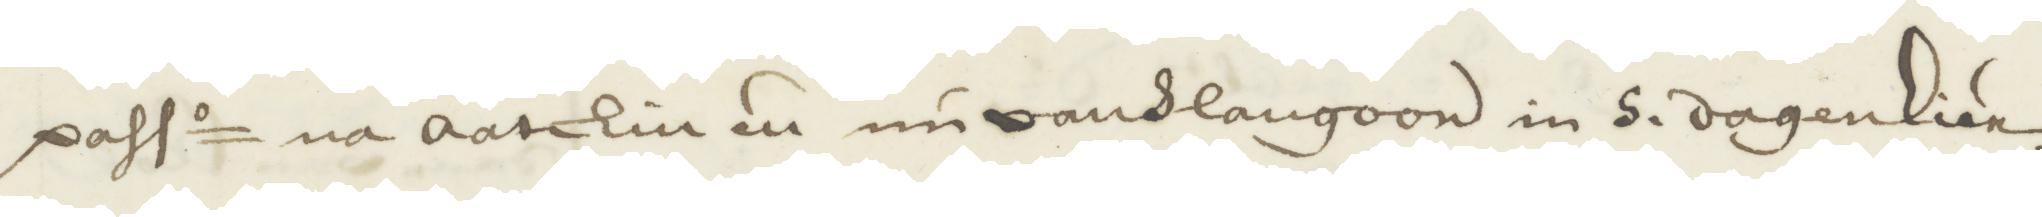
pass=o na aatchin en nu van Slangoor in 5. dagen hier.
